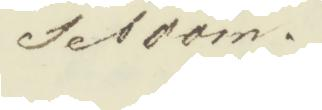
seboom.
